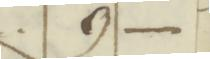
9 —
